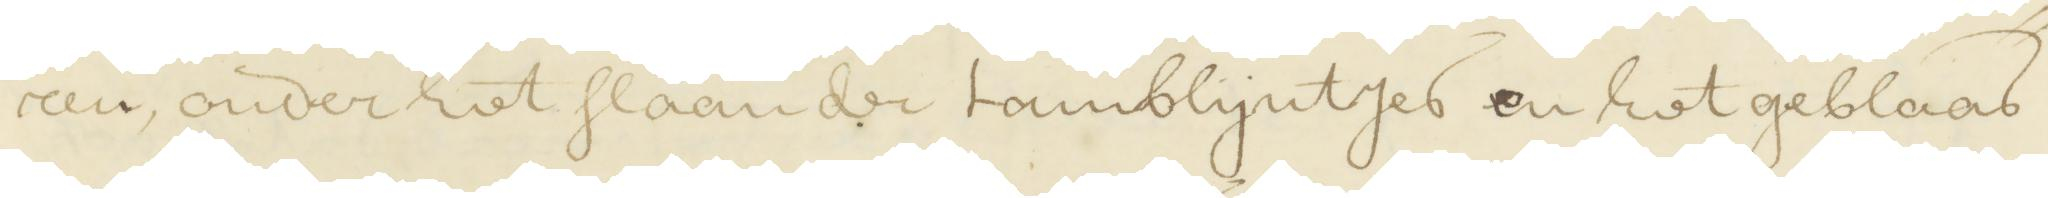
ren, onder het slaan der tamblijntjes en het geblaas
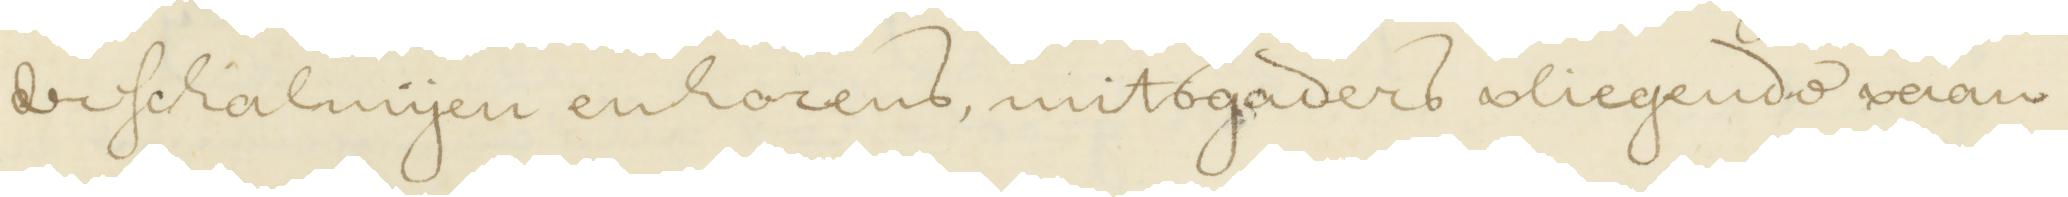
derschalmijen en horens, mitsgaders vliegende vaan
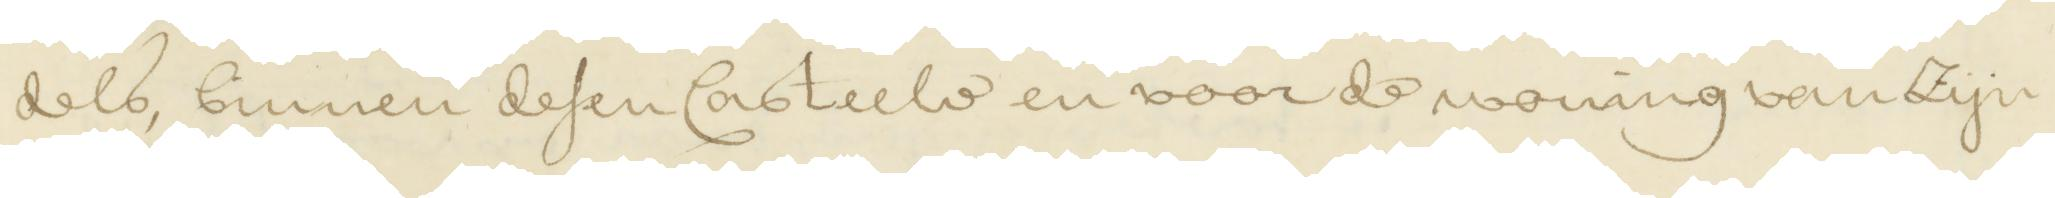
dels, binnen desen Casteele en voor de woning van zijn
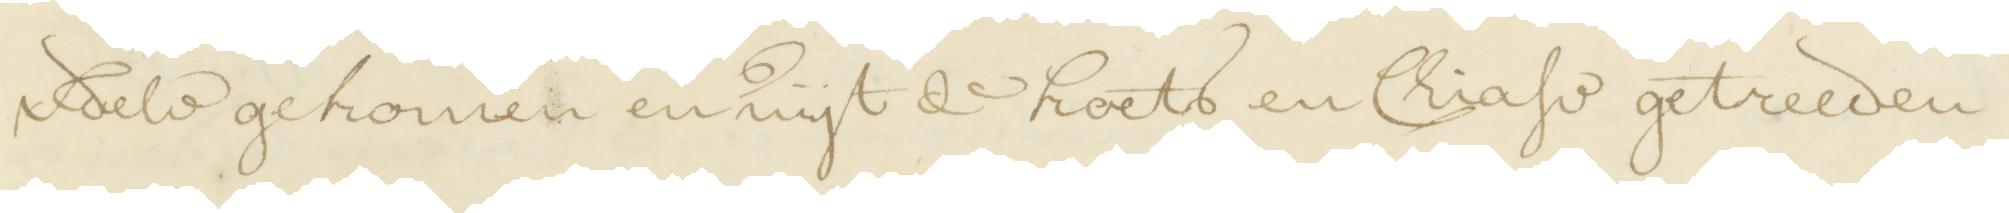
Edele gekomen en uijt de koets en Chiase getreeden
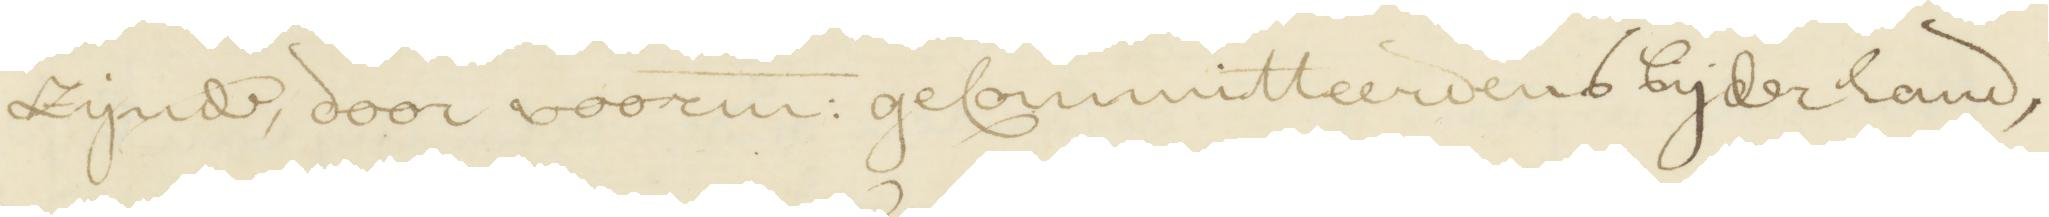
zijnde, door voorm: gecommitteerdens bij der hand,
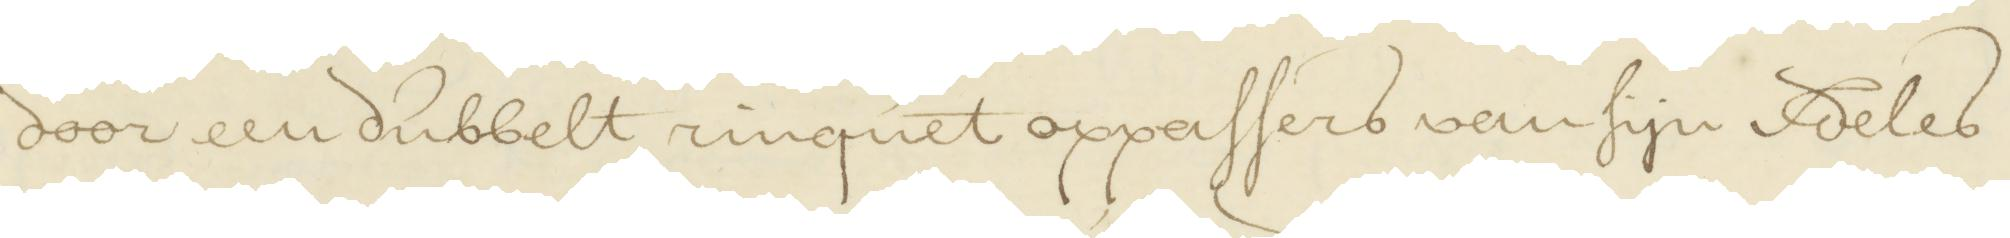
door een dubbelt rinquet oppassers van sijn Edeles
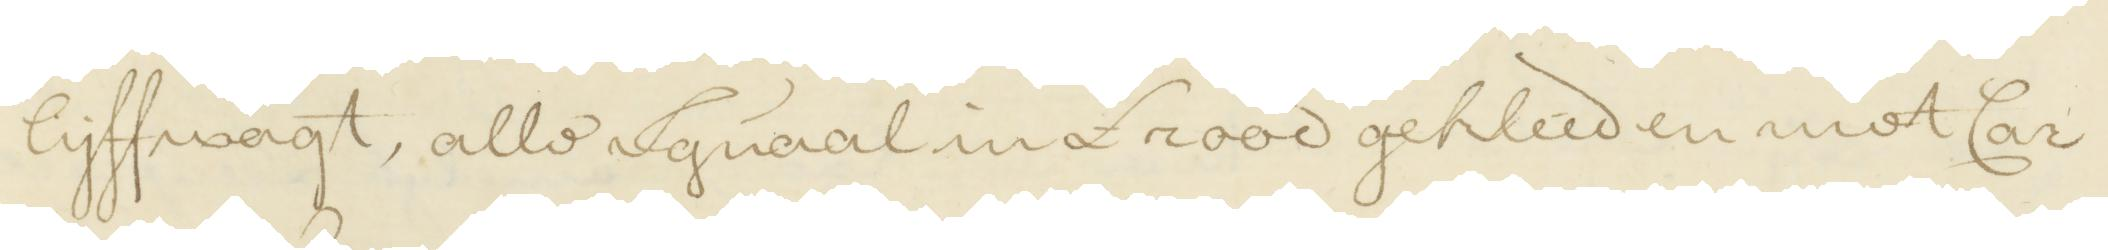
lijffwagt, alle Eguaal in 't rood gekleed en met Car
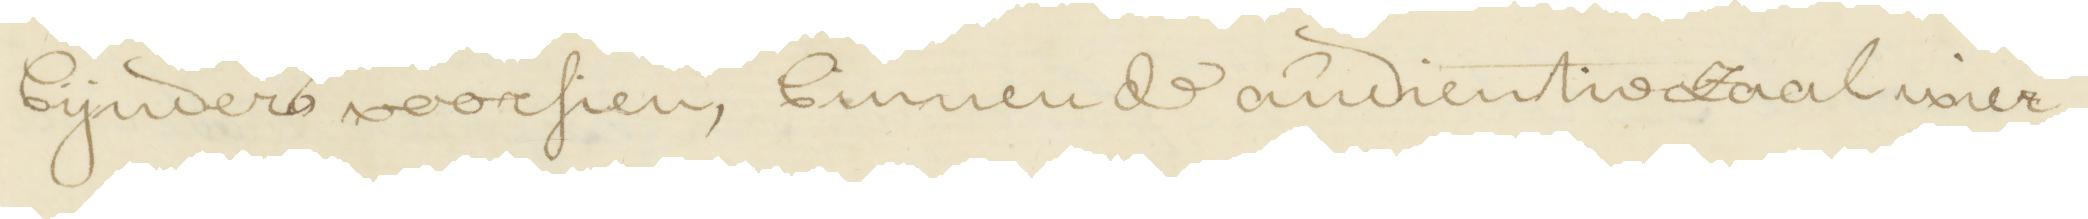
bijnders voorsien, binnen de audientiezaal wier
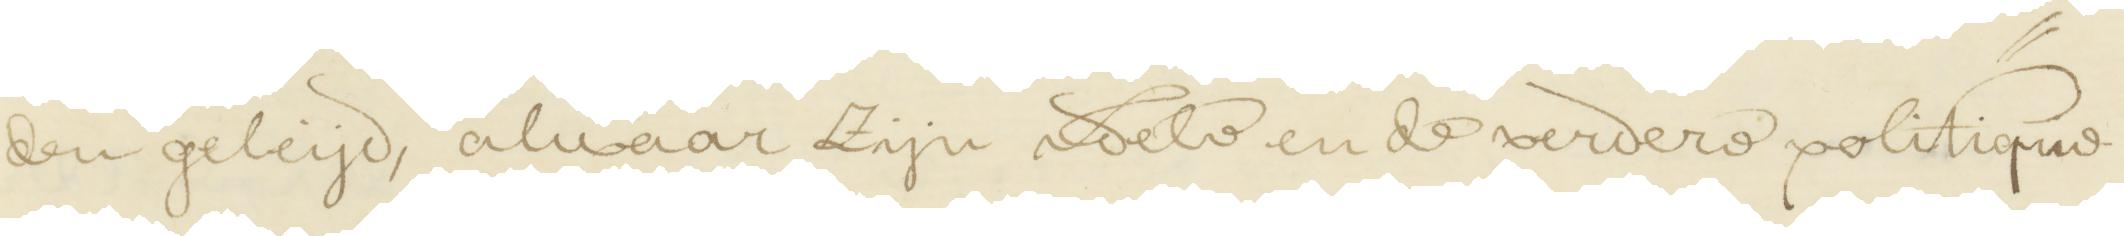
den geleijd, alwaar zijn Edele en de verdere politique
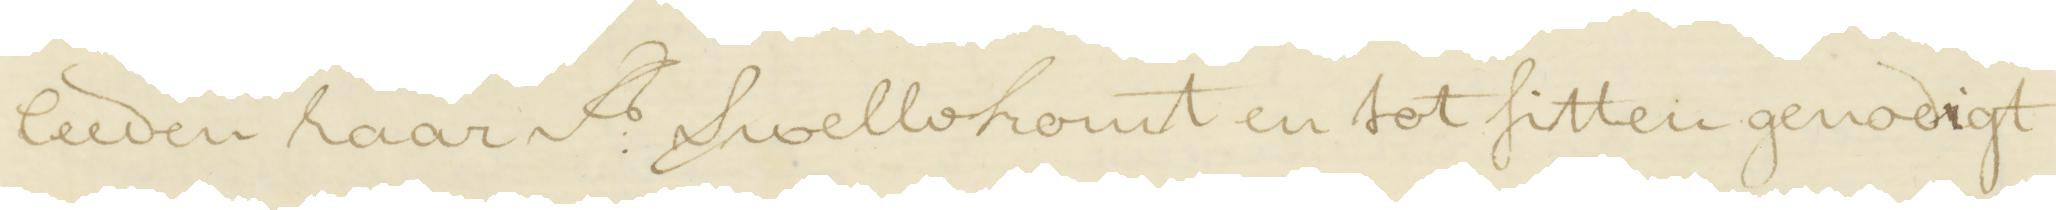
leeden haar E:s verwellekomt en tot sitten genodigt
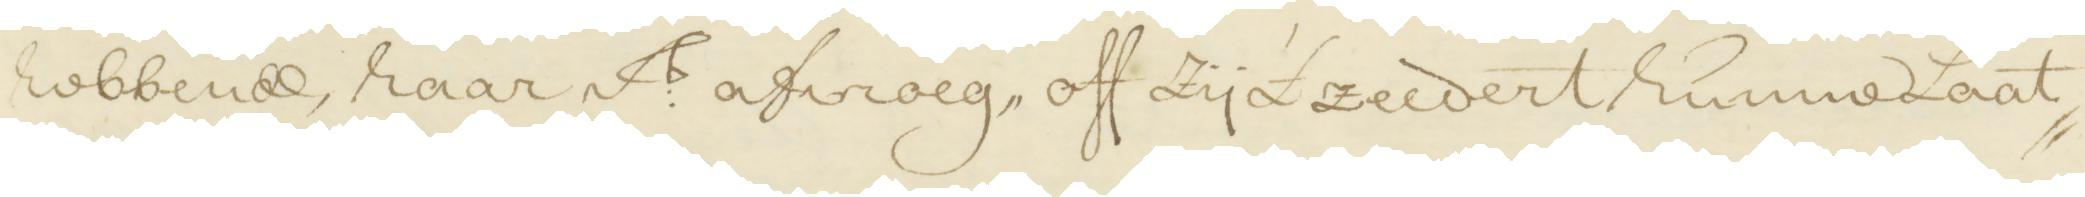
hebbende, haar E:s afvroeg„ off zij 't zeedert hunne Laat„
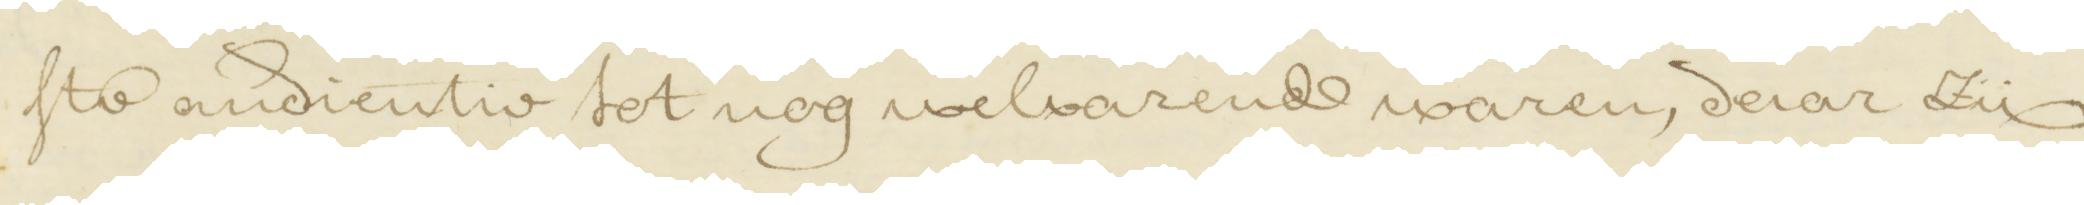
ste audientie tot nog welvarende waren, daar zij
